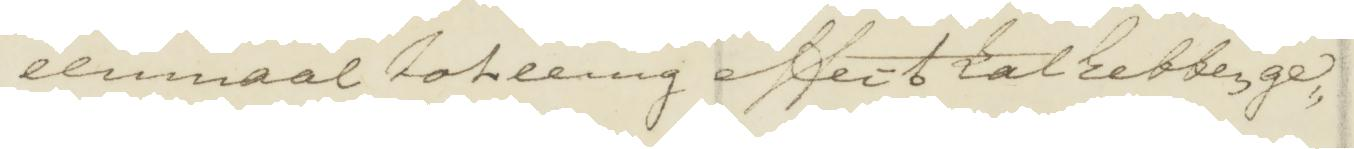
eenmaal tot eenig effect zal hebben ge„
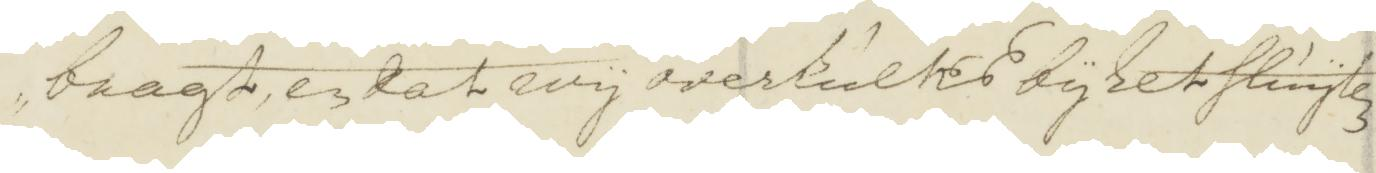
„bragt, en dat wij overzulks bij het sluijten
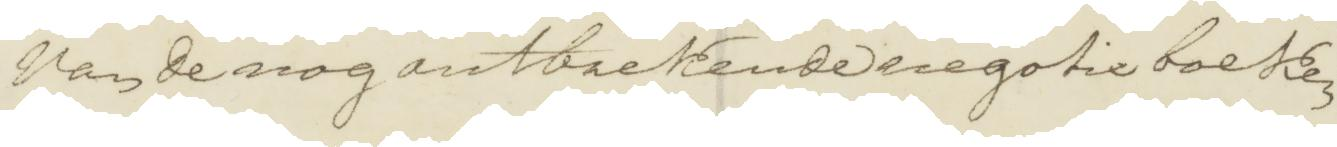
van de nog ontbrekende negotie boeken
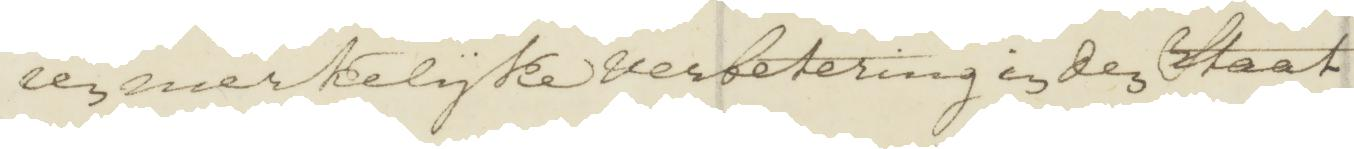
een merkelijke verbetering in de staat
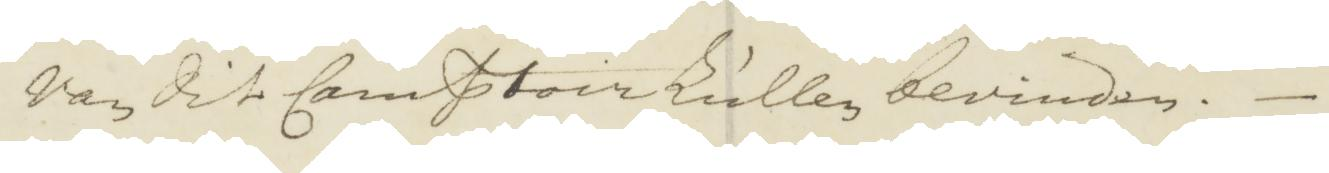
van dit Comptoir zullen bevinden. —
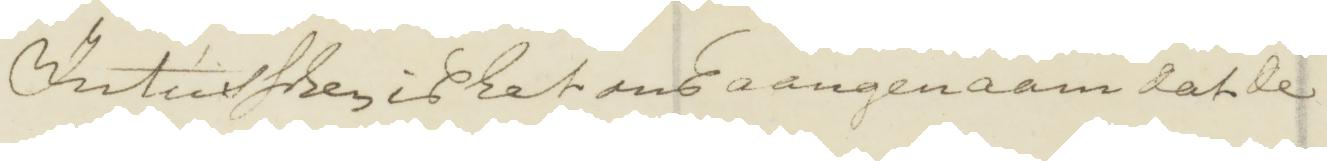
Intusschen is het ons aangenaam dat de
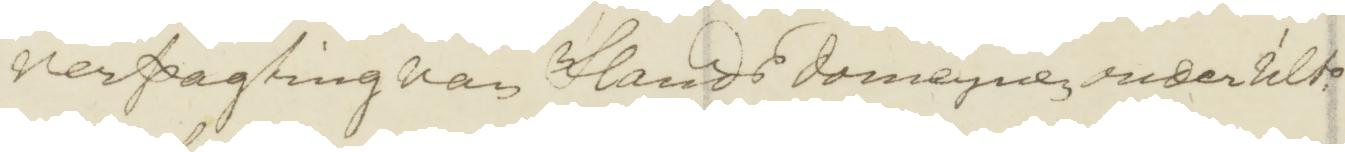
verpagting van 'slands domeijnen onder ult„o
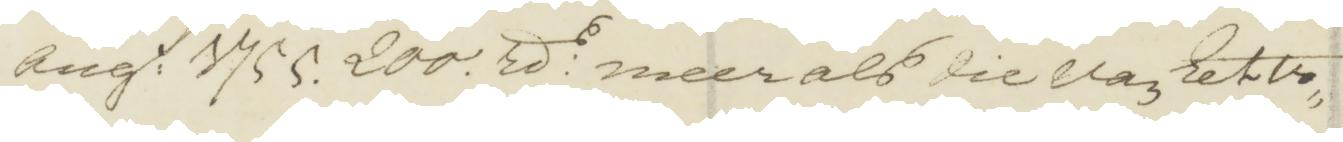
aug:s 1755. 200. rd:s meer als die van het vo„
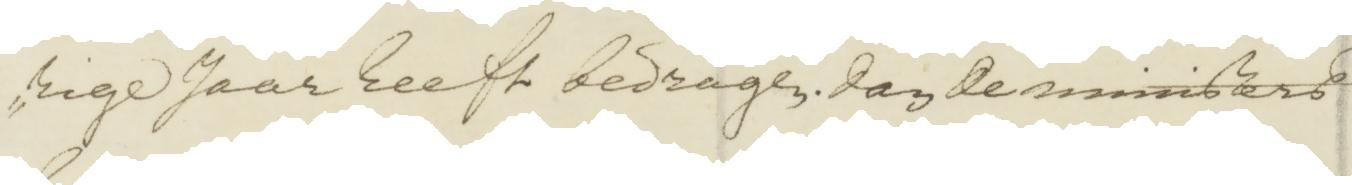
„rige Jaar heeft bedragen dan de ministers
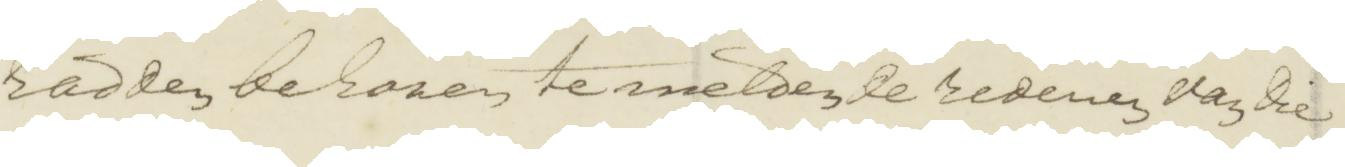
hadden behoren te melden de redenen van die
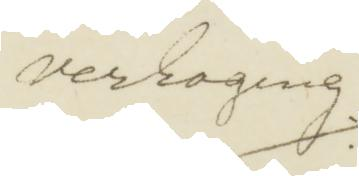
verhoging
